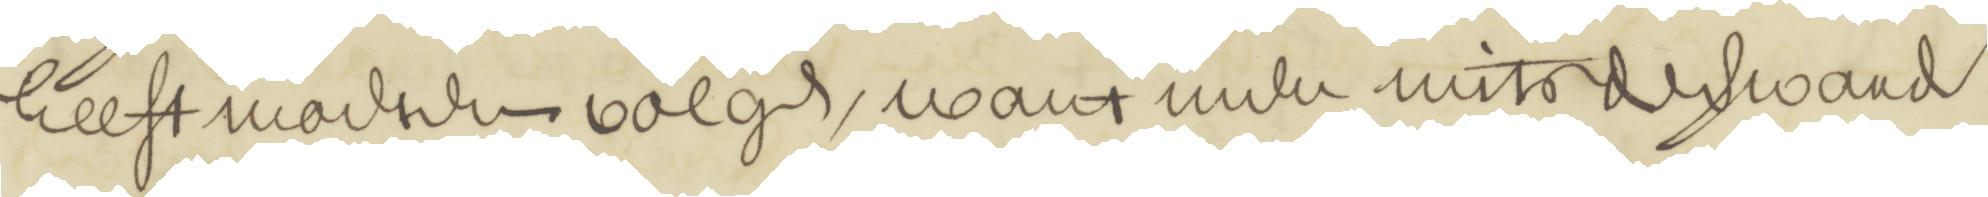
heeft moeten volgen, want men mits deverwarde
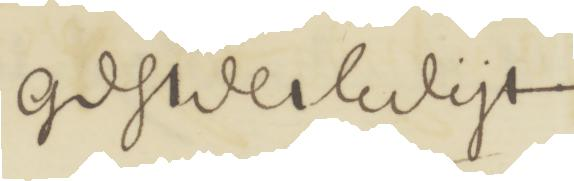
gesteltheijt
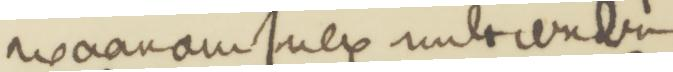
waarom sulx niet eerder
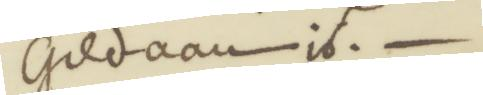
gedaan is. —
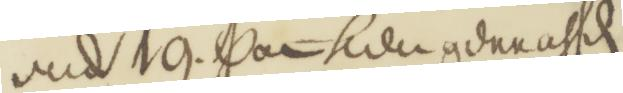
ende 19. packen gerrassen
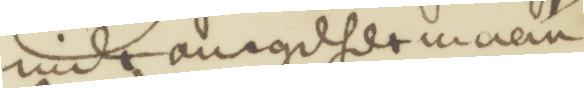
niet omgeset maar
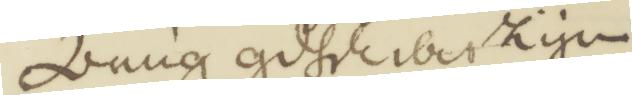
terug geschikt zijn
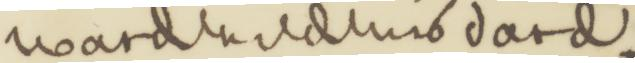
watderedenis dat de
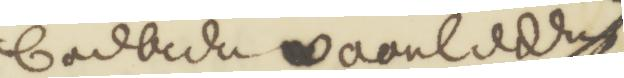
boeken voorleden
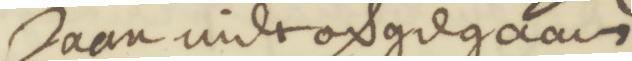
Jaar niet overgegaan
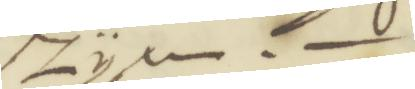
zijn. —
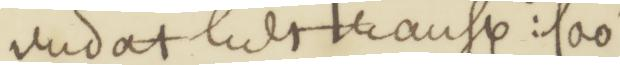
endat het transp:t soo
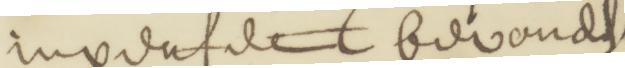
inperfect bevonden
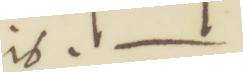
is. —
